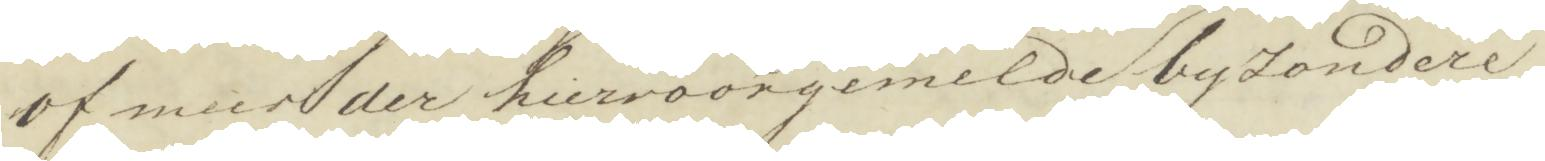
of meer der hiervoorgemelde byzondere
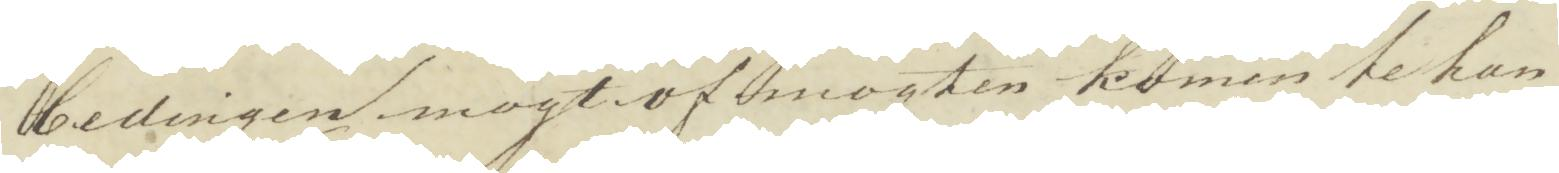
bedingen mogt of mogten komen te han
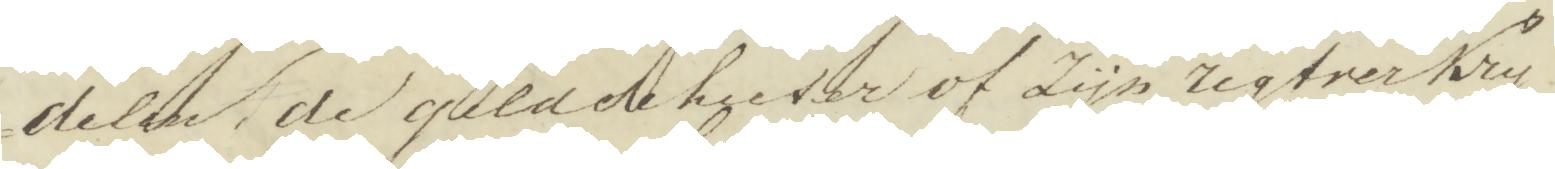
„delen, de geldschieter of zijn regtverkry„
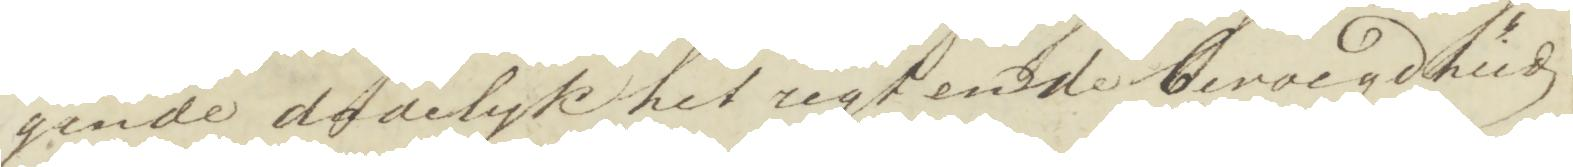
gende dadelyk het regt ende bevoegdheid
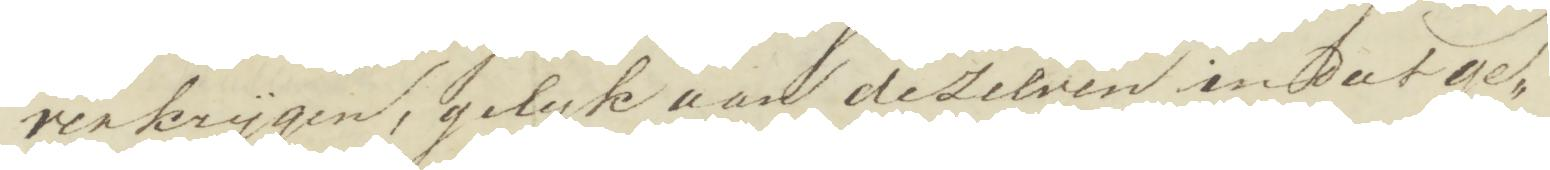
verkrijgen, gelyk aan dezelven in dat ge„
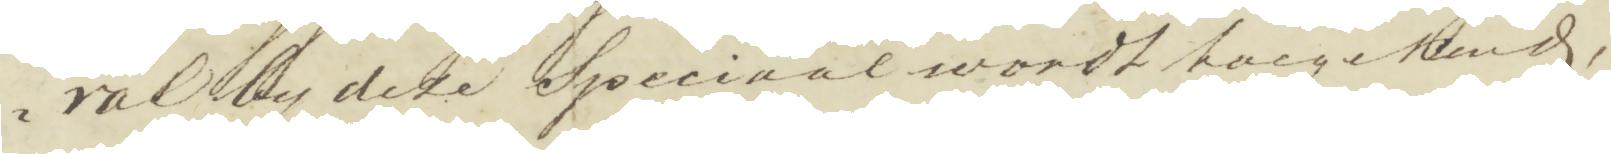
„val by deze speciaal wordt toegekend,
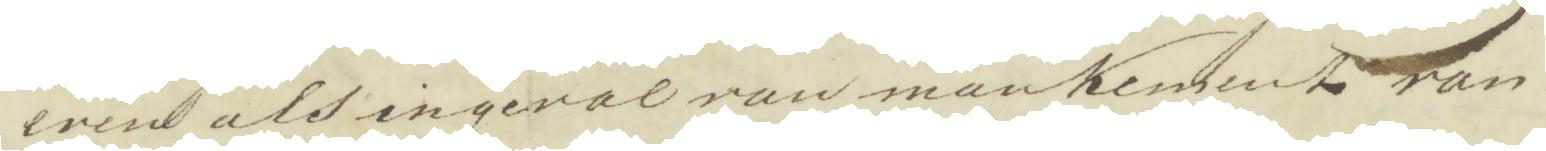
even als ingeval van mankement van
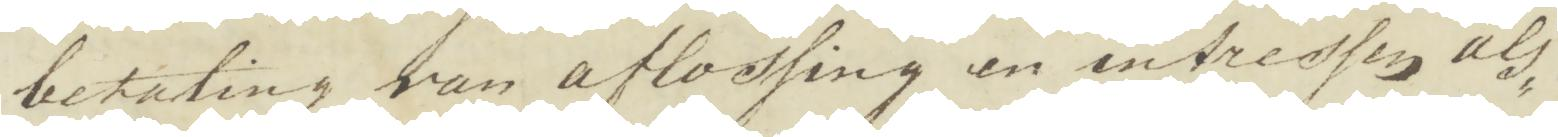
betaling van aflossing en intressen als„
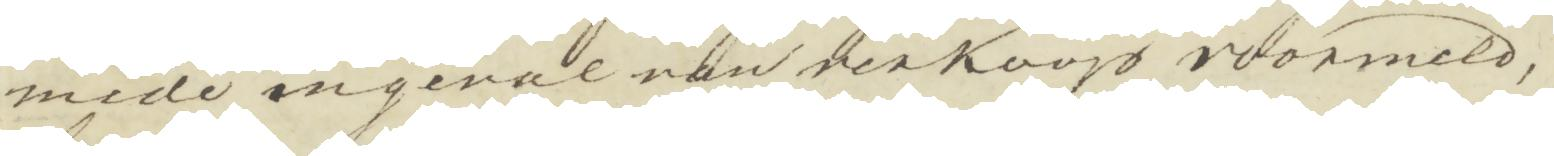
mede ingeval van verkoop voormeld,
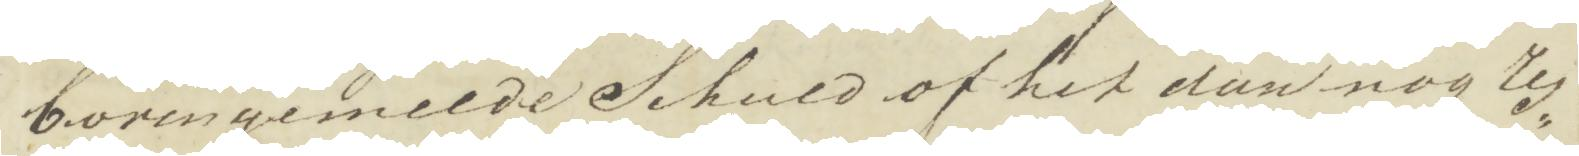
bovengemelde schuld of het dan nog res„
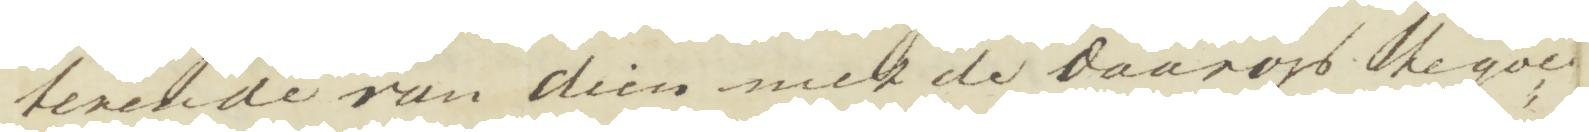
terende van dien met de daarop te goe„
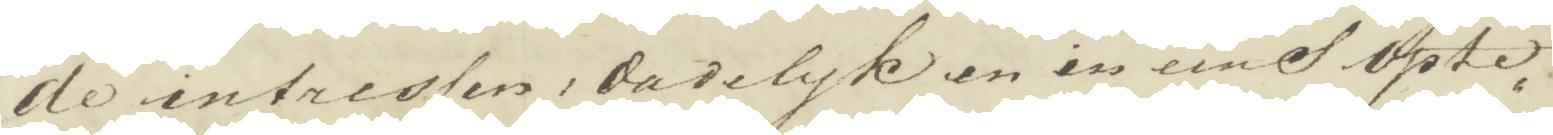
de intressen, dadelyk en in eens opte„
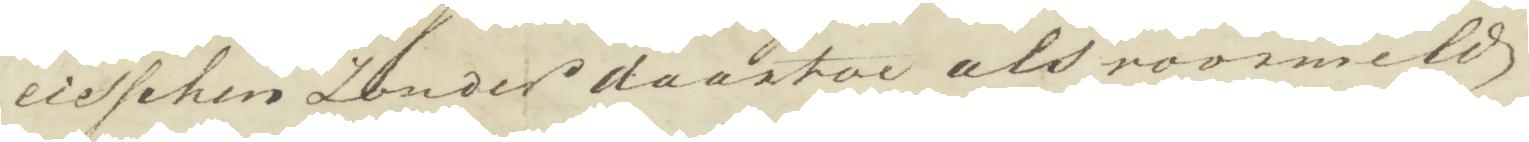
eisschen zonder daartoe als voormeld
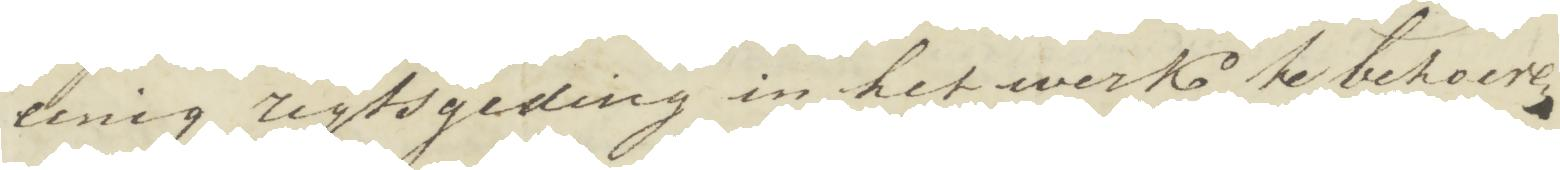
eenig regtsgeding in het werk te behoeven
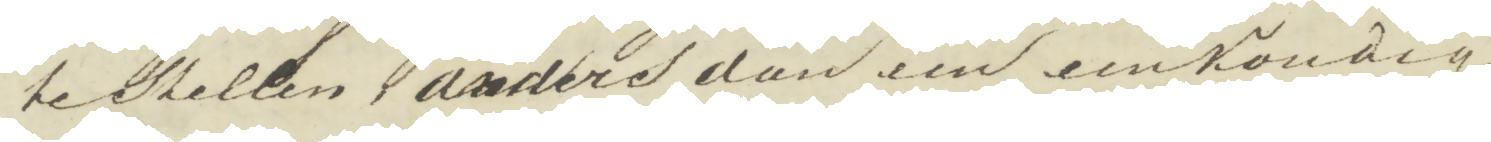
te stellen, anders dan een eenvoudig
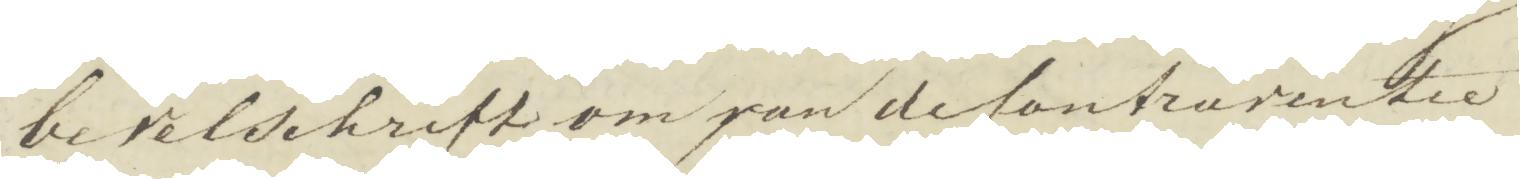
bevelschrift om van de Contraventie
